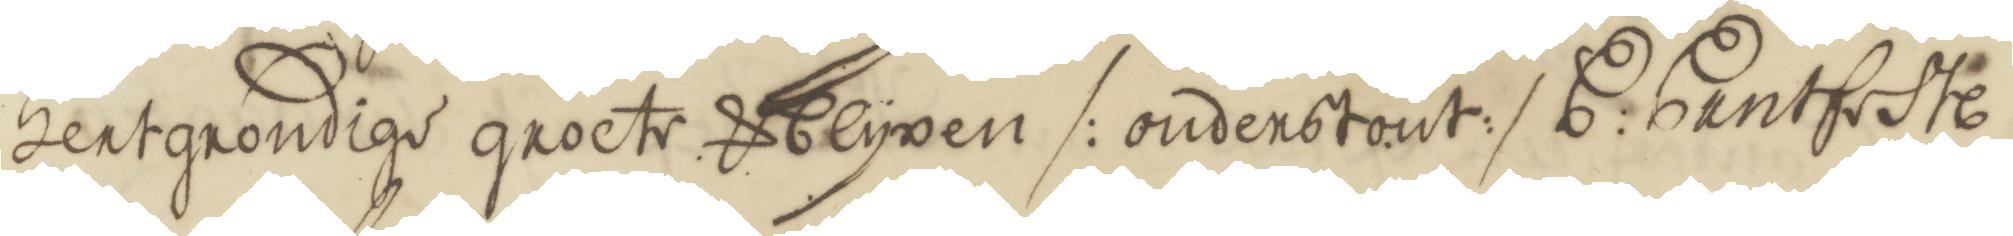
hertgrondige groete verblijven /: onderstont:/ E: Erntfeste
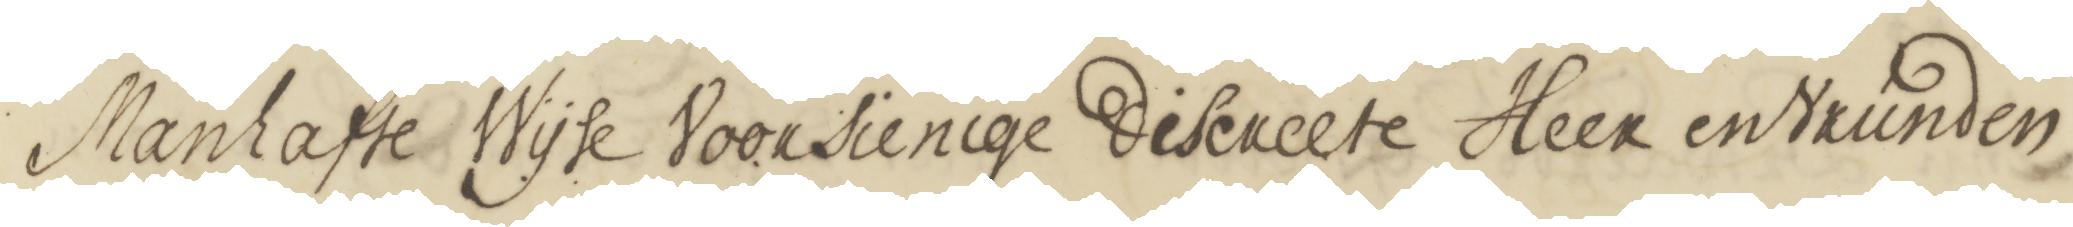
Manhafte Wijse Voorsienige discreete Heer en Vrunden
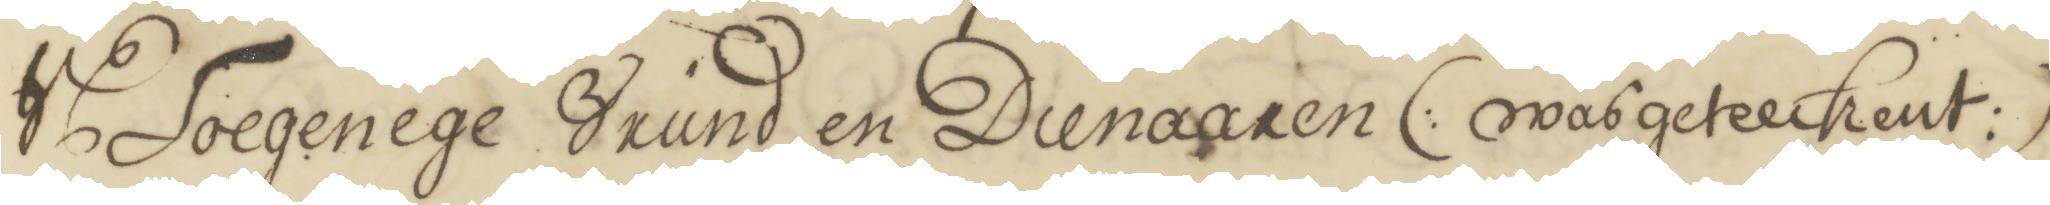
UE Toegenege Vrund en Dienaaren (: was geteeckent: )
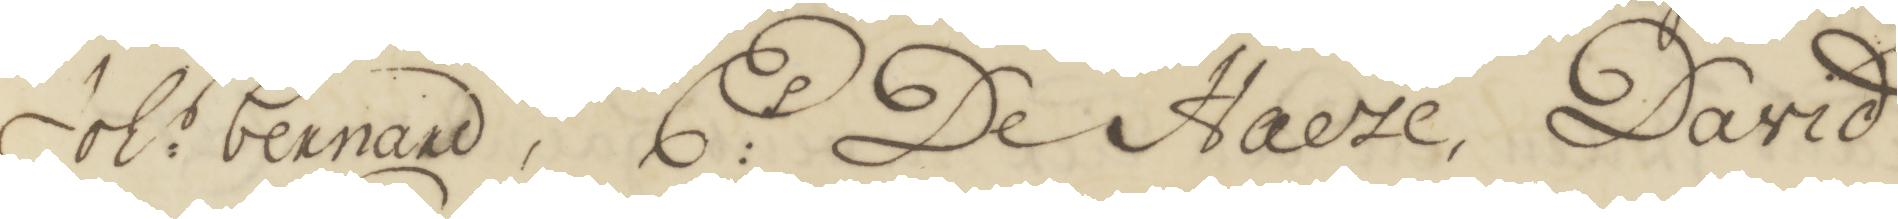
Joh:s bernard, E:s De Haeze, David
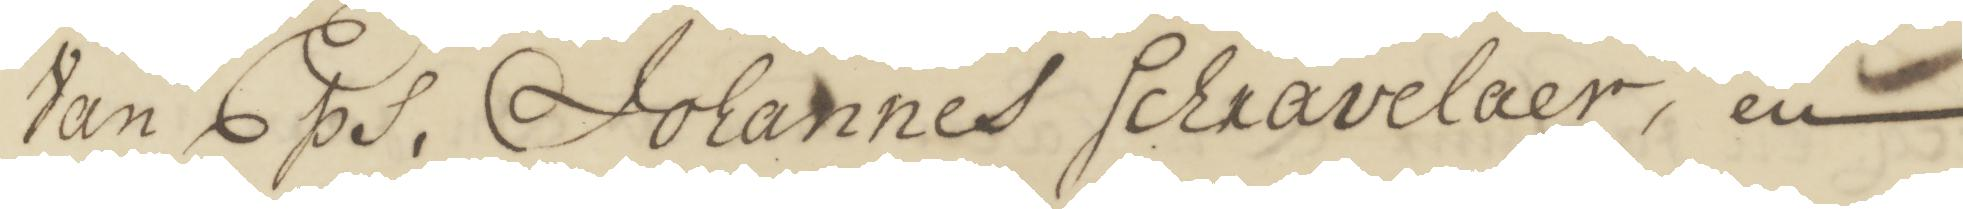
Van Eps. Iohannes Schravelaer, en
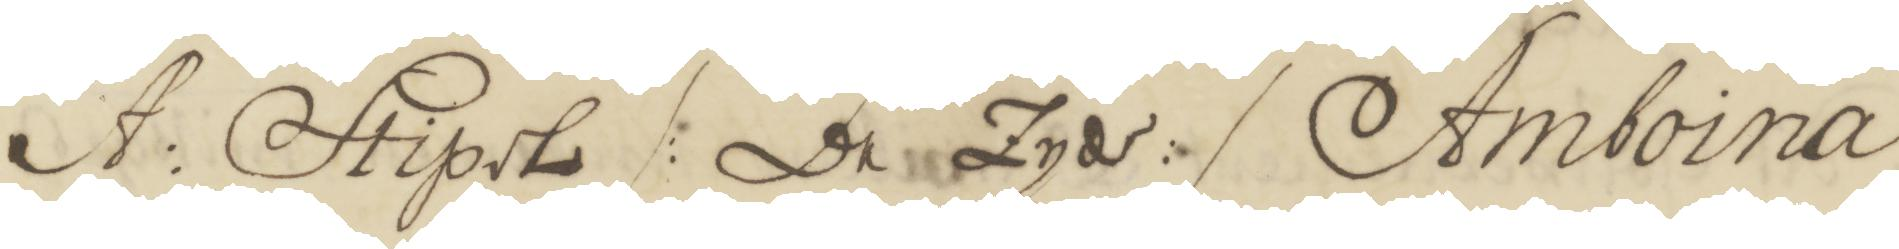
A: Stipel /: ter Zyde:/ Amboina
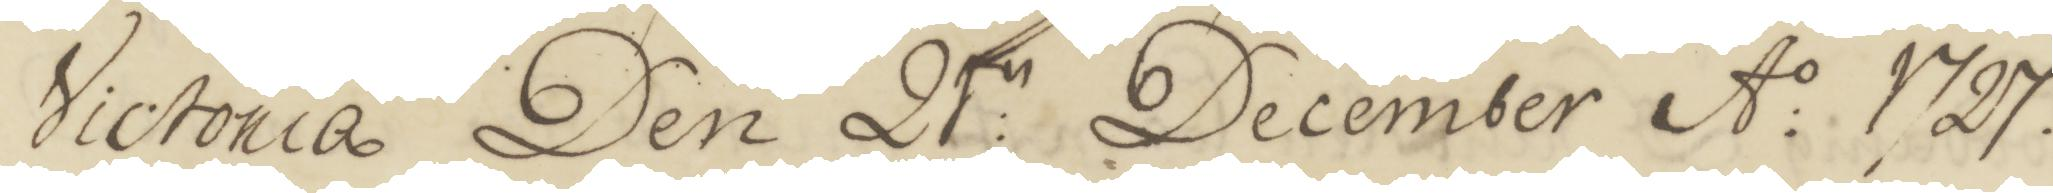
Victoria Den 21:' December A:o 1727.
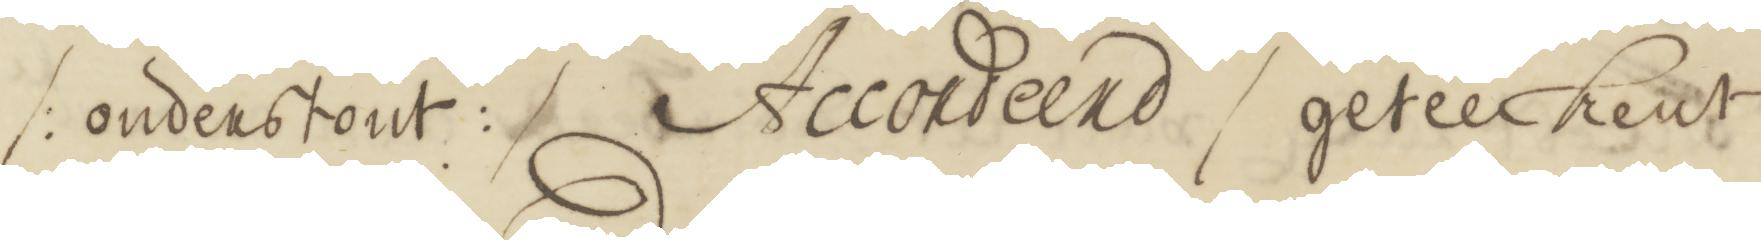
/: onderstont :/ Accordeerd / geteeckent:/
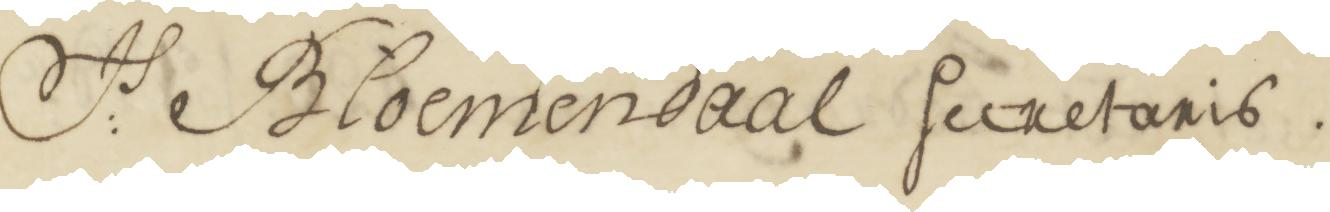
J:s Bloemendaal secretaris.
